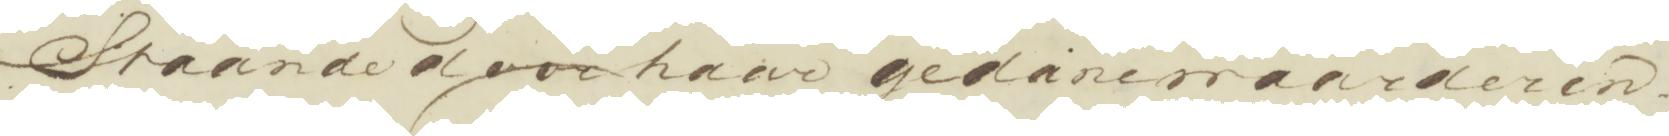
staande door haar gedane waarderin,
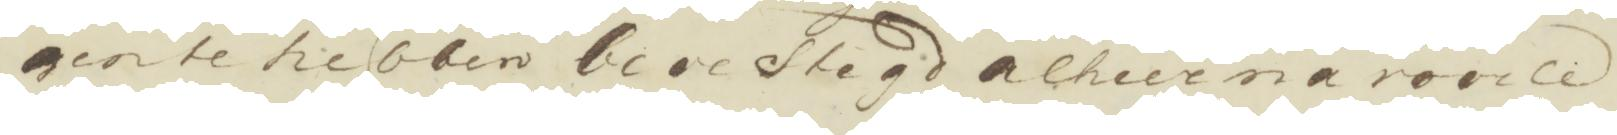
gen te hebben bevestigd alhier na voorle
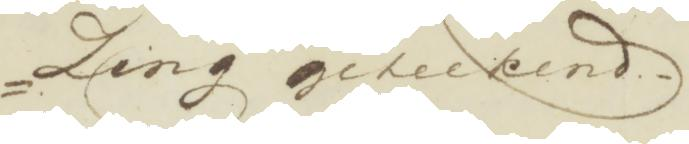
=zing geteekend.-
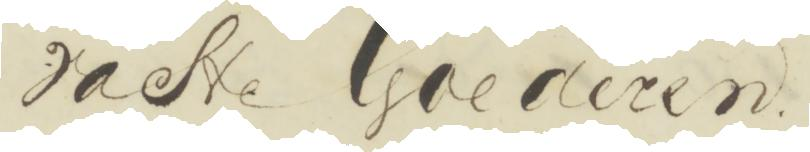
vaste Goederen.
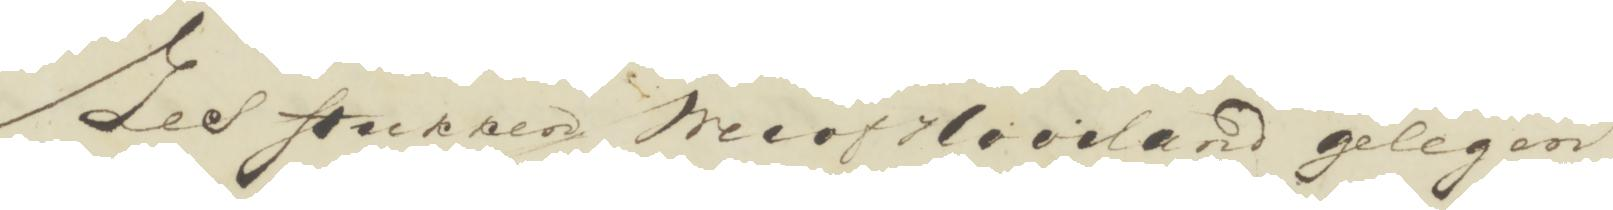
Zes stukken Wei of Hooiland gelegen
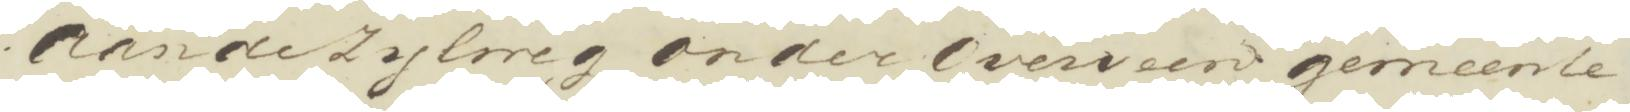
Aan de zylweg onder Overveen gemeente
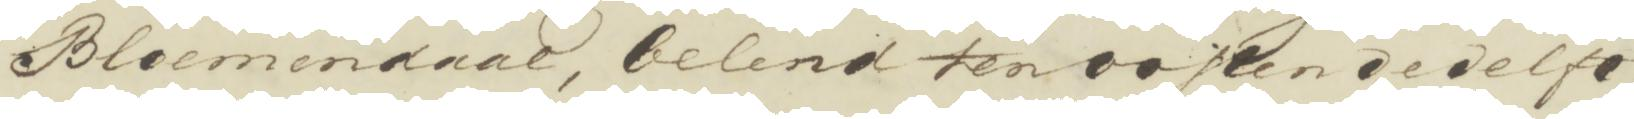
Bloemendaal, belend ten oosten de delft
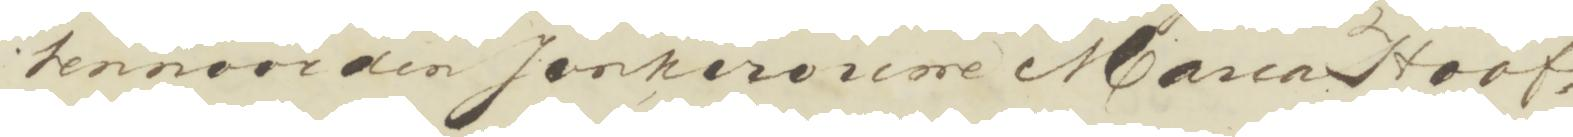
ten noorden Jonkvrouwe Maria Hoof:
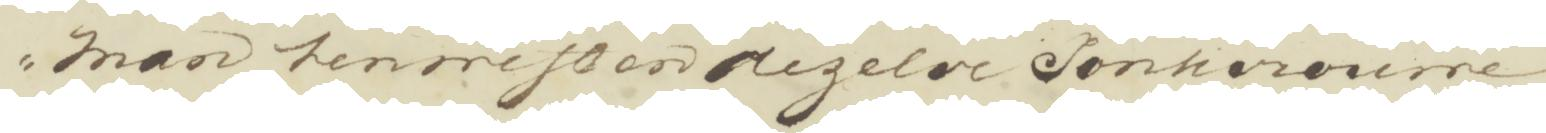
„man ten westen dezelve Ionkvrouwe
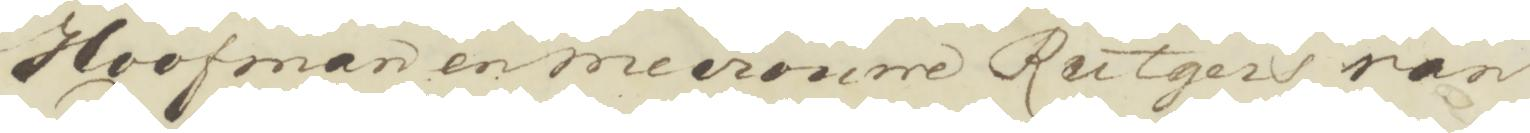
Hoofman en mevrouwe Rutgers van
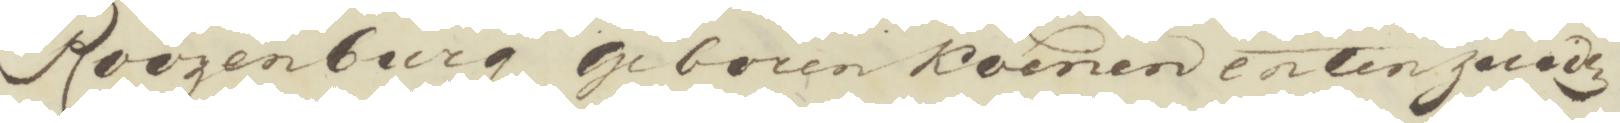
Roozenburg geboren koenen en ten zuiden
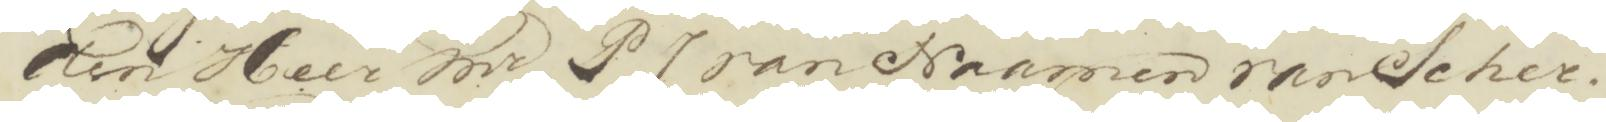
den Heer mr PJ van Naamen van Scher.
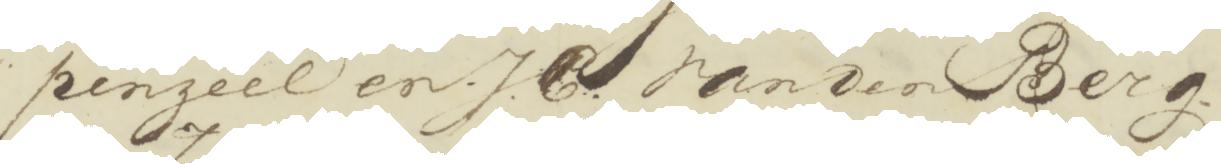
penzeel en J.E. van den Berg.
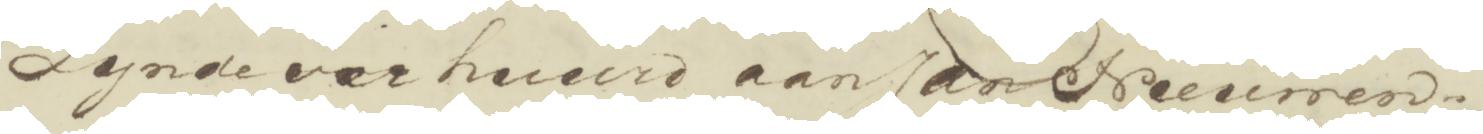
Zynde verhuurd aan Jan Nieuwen..
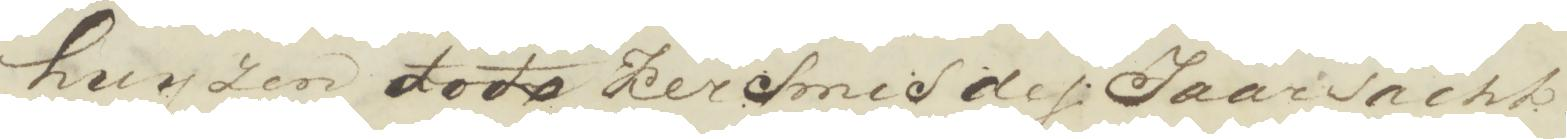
huyzen tot Kersmis des Iaars acht
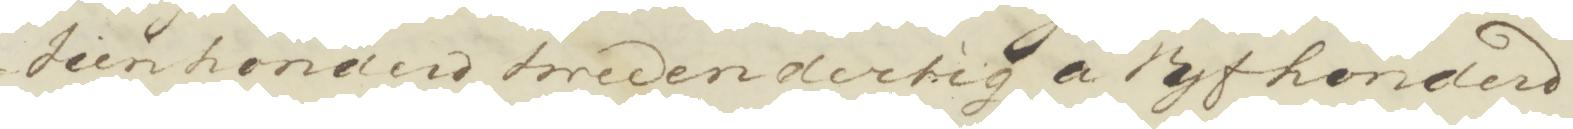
=tien honderd twee en dertig a vyfhonderd
